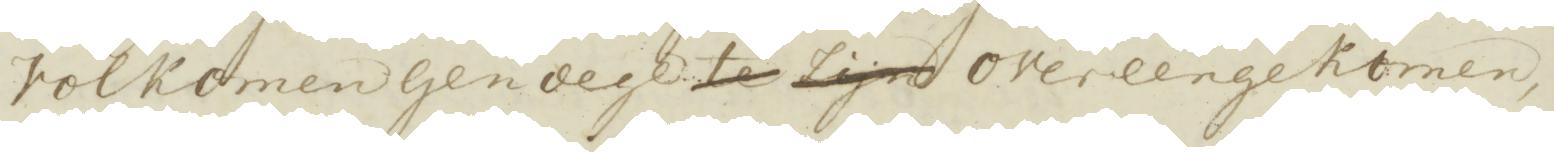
volkomen genoege te zijn overeengekomen,
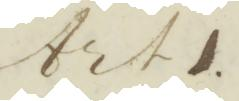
Art 1.
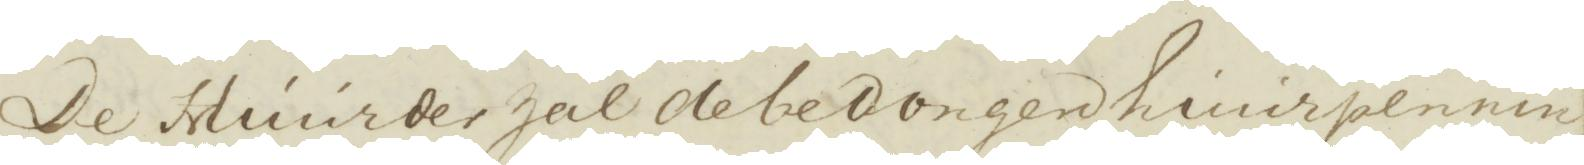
De Huurder zal de bedongen huurpennin
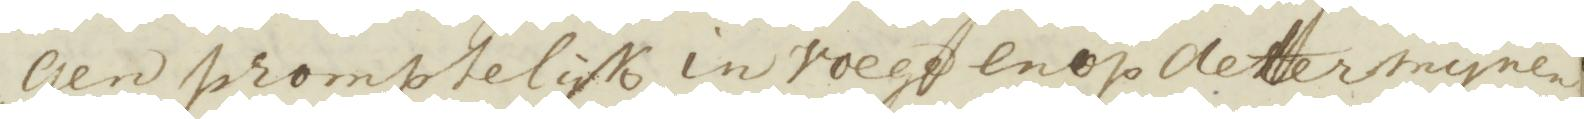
„gen promptelijk in voege en op de termijnen
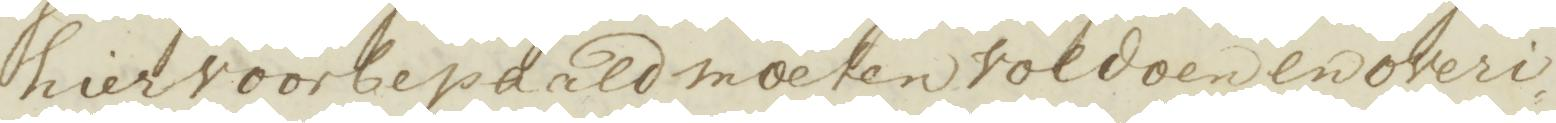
hiervoor bepaald moeten voldoen en overi„
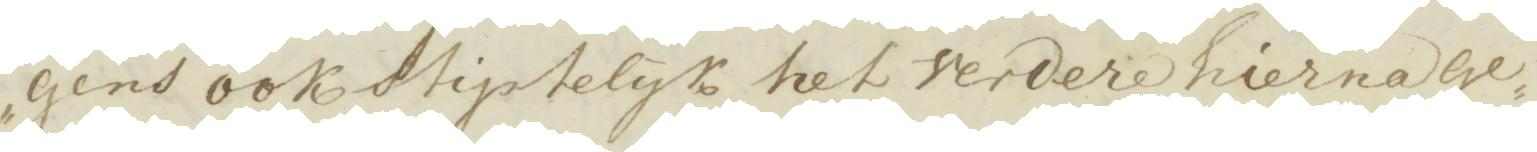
„gens ook stiptelijk het verdere hierna ge„
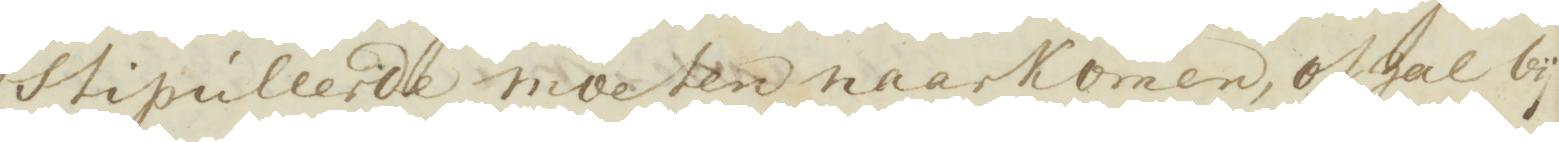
„stipuleerde moeten naarkomen, of zal bij
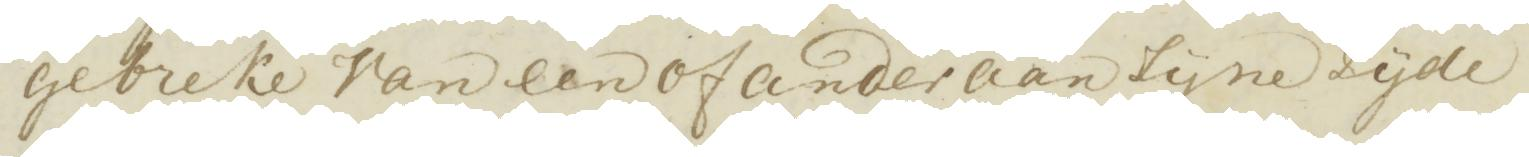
gebreke van een of ander aan zijne zijde
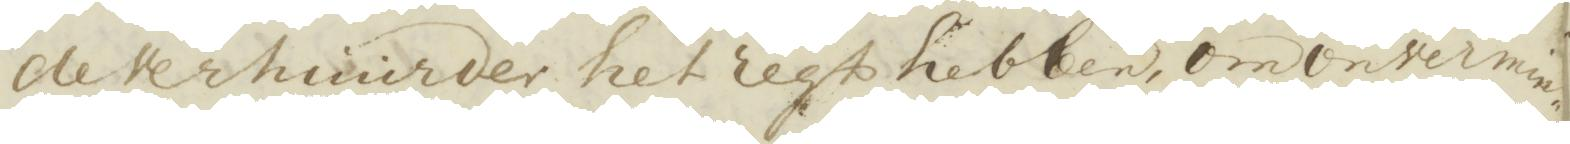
de verhuurder het regt hebben, om onvermin„
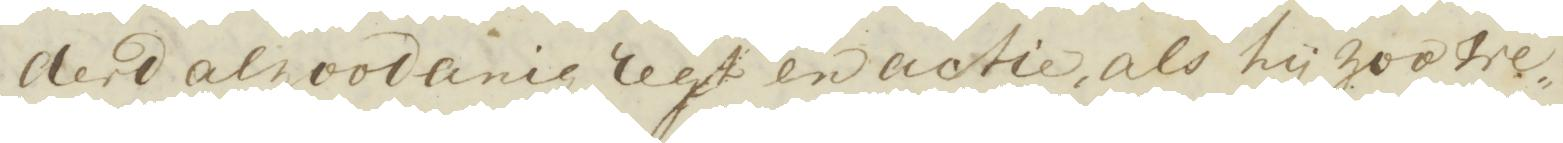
derd alzoodanig regt en actie, als hij zoo we„
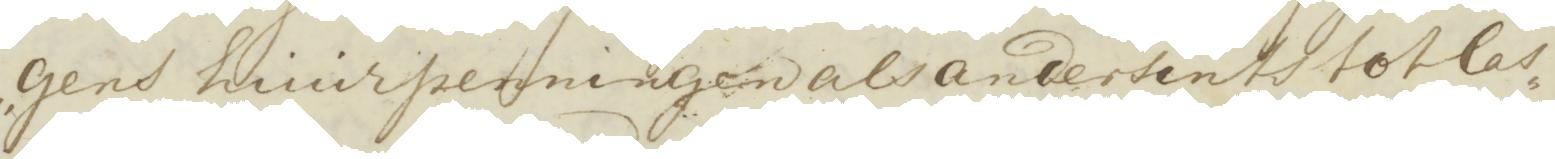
„gens huurpenningen als andersints tot las„
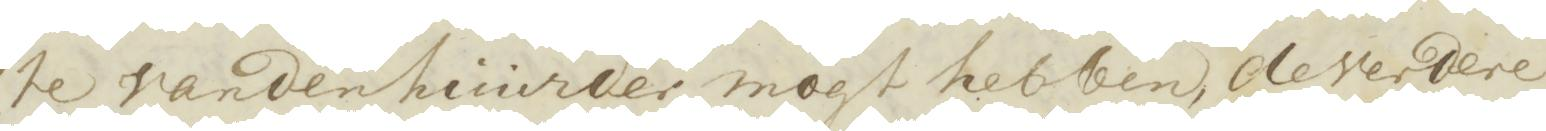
te van den huurder mogt hebben, de verdere
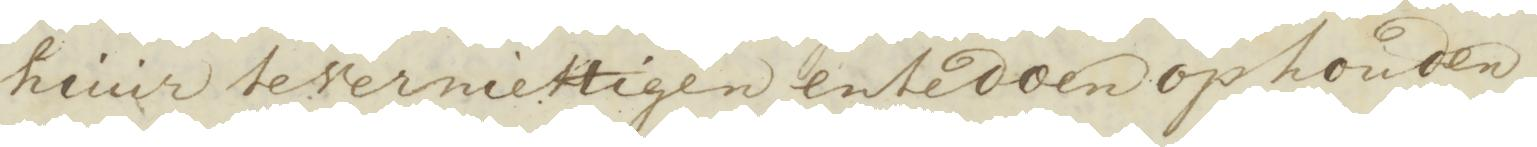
huur te verniettigen en te doen ophouden
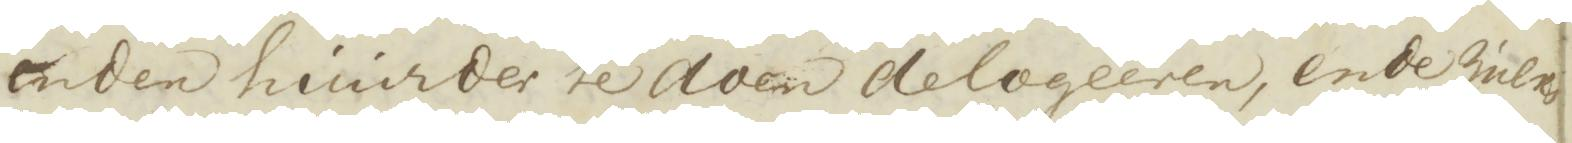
en den huurder te doen delogeeren, ende zulx
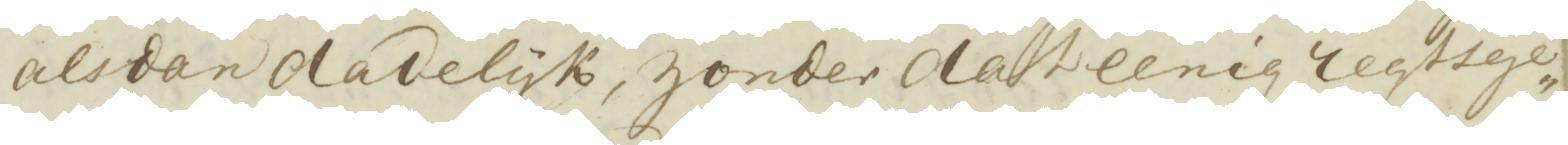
als dan dadelijk, zonder dat eenig regtsge„
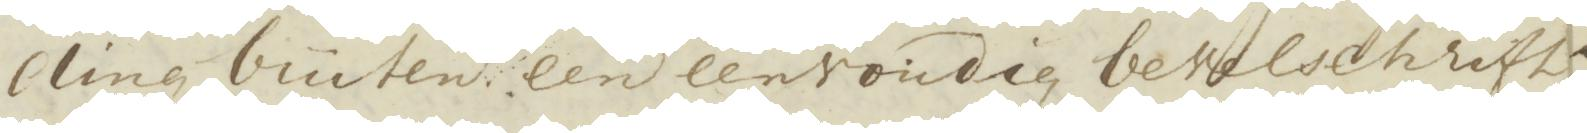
ding buiten een eenvoudig bevelschrifts
